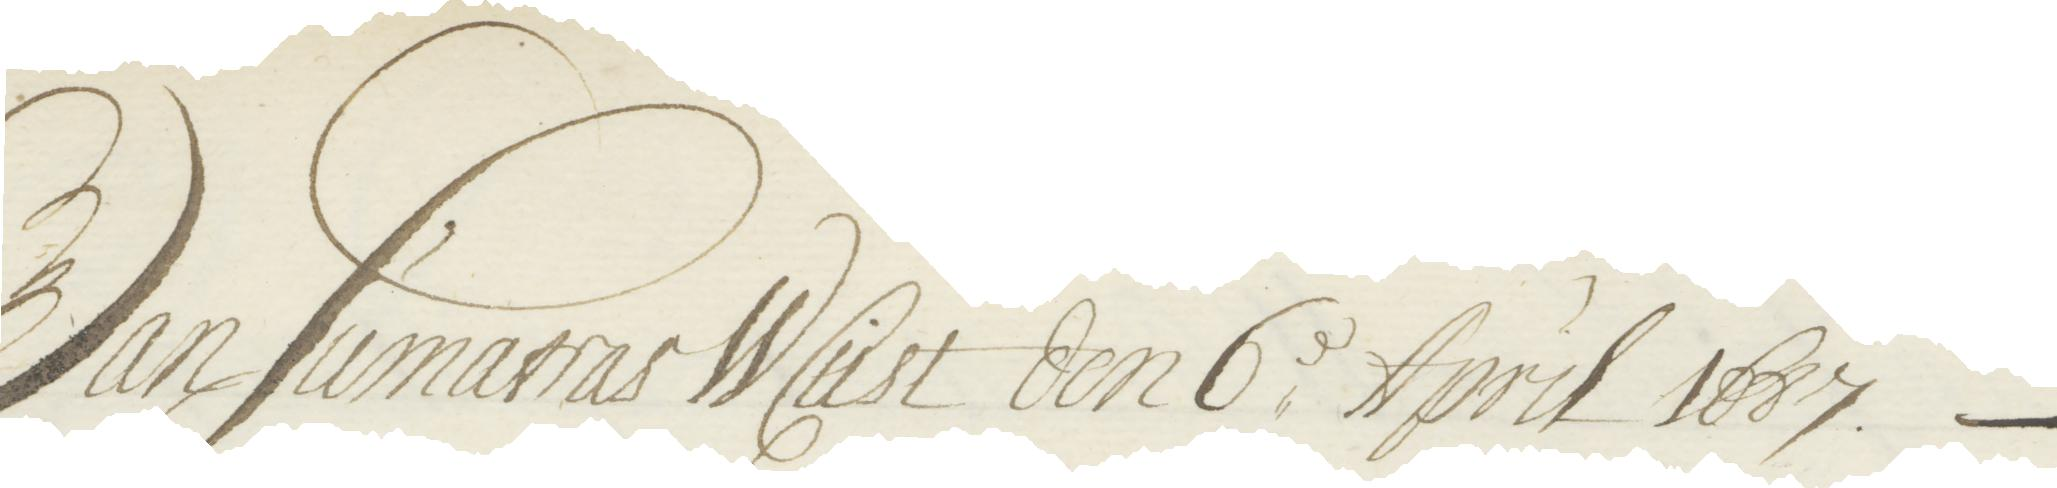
Van Sumatras W Cust den 6„e April 1687.
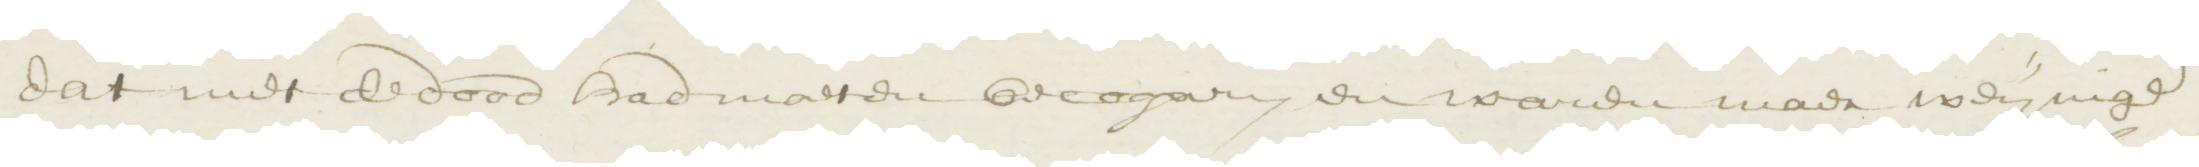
dat met de dood had moeten becoopen, en waren maer weijnige
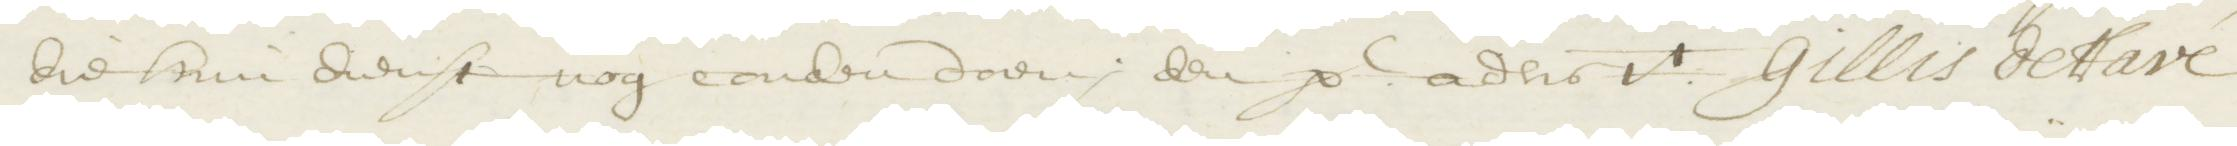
die hun dienst nog conden doen; den p=l adlist=t Gillis dettave
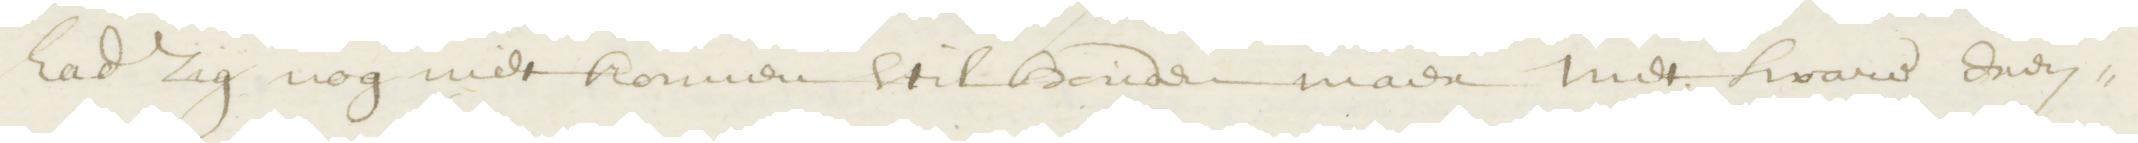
had Zig nog niet konnen stil houden maer met sware dreij„
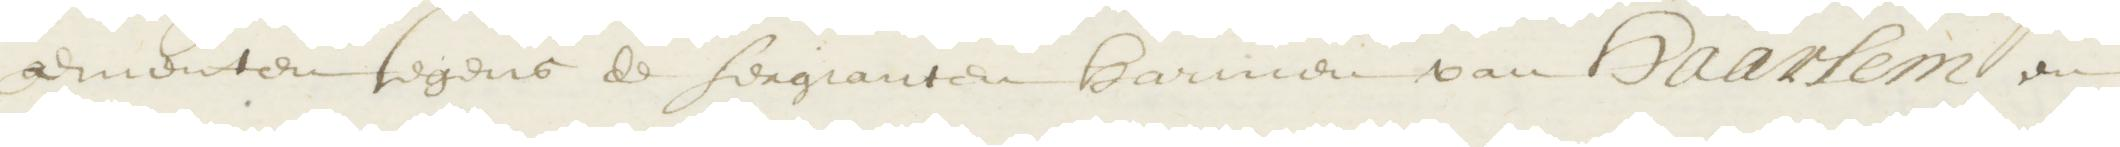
gementen tegens de sergianten harmen van Haarlem en
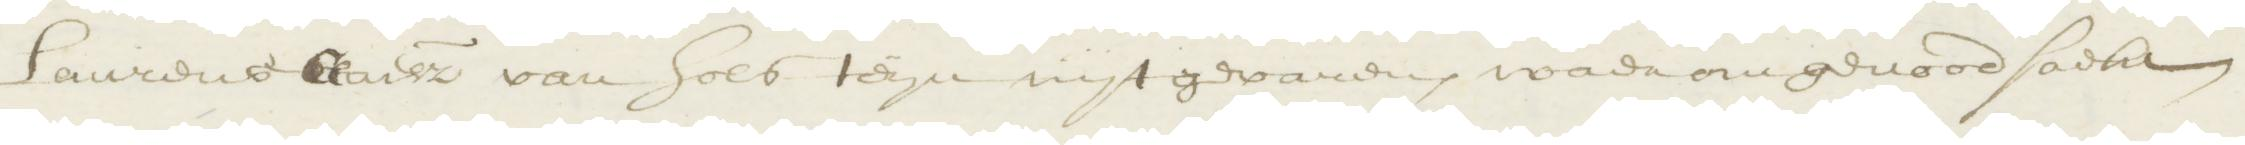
laurens Claesz van holsteijn uijt gevaren, waer om genoodsaekt
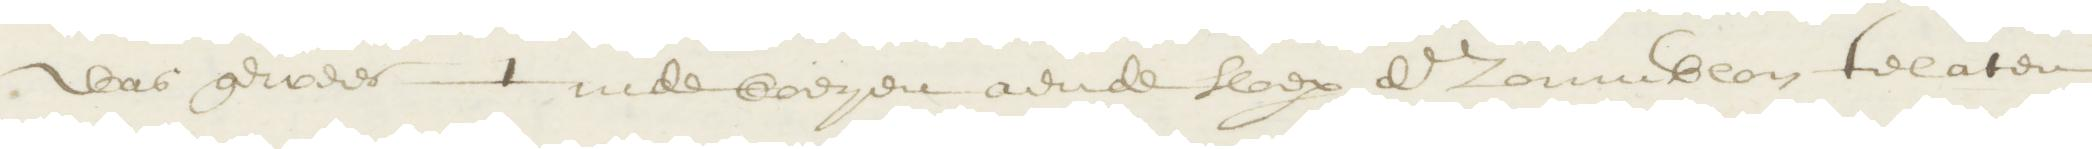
was geweest inde boeijen aen de sloep de zonneblom telaten
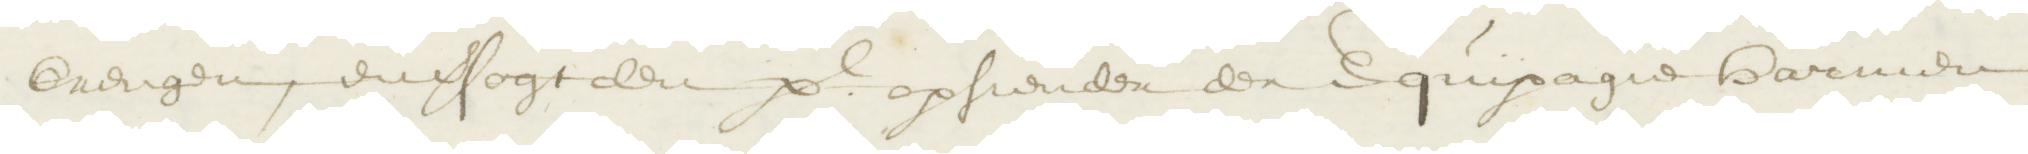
brengen, en versogt den p=l opsiender der Equipagie harmen
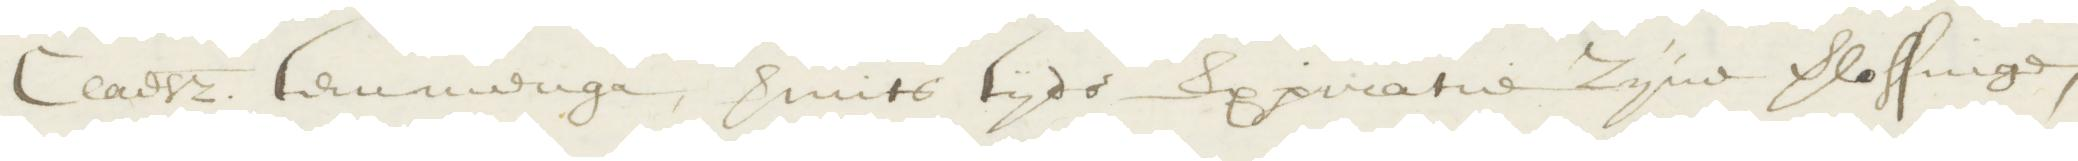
Claesz. temmenga, vermits tijds Expiratie Zijne verlossinge,
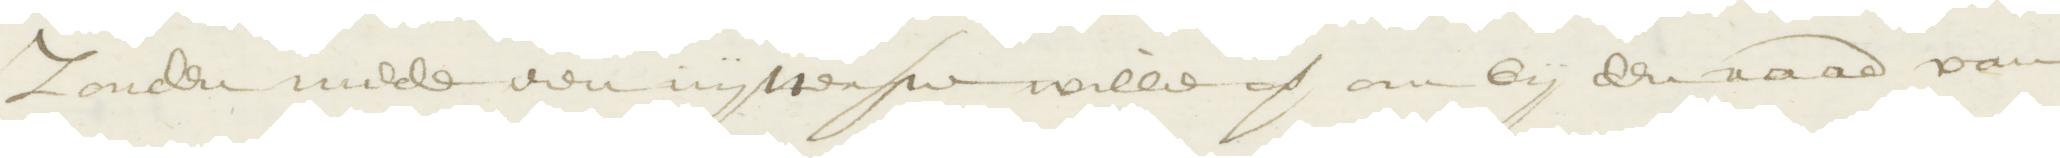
Zonden mede een uijtterste wille of om bij den raad van
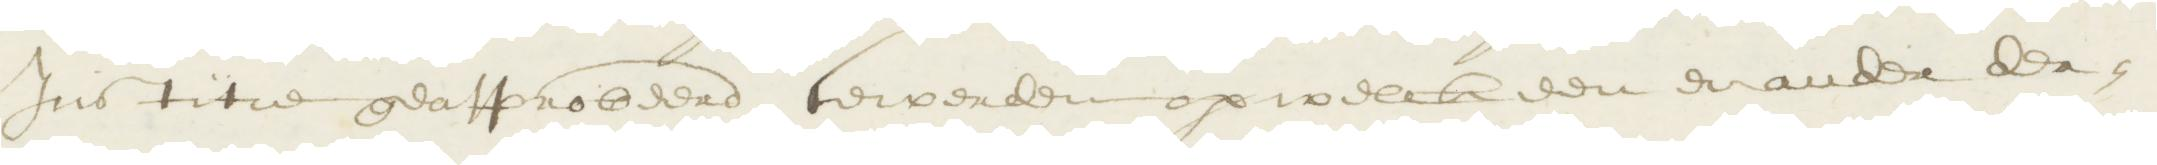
Justitie geapprobeerd tewerden op welck een en ander der„
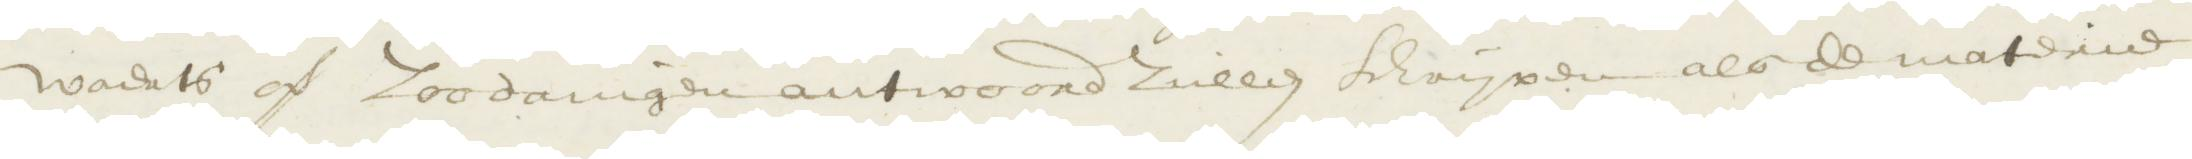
waerts of Zoodanigen antwoord Zullen schrijven als de materie
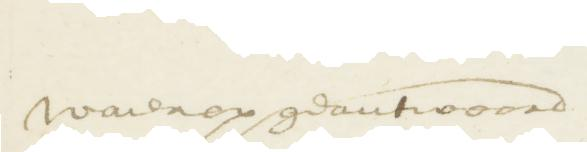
waerop geantwoord
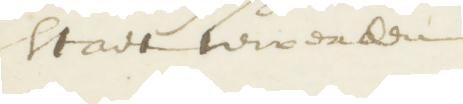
staet tewerden
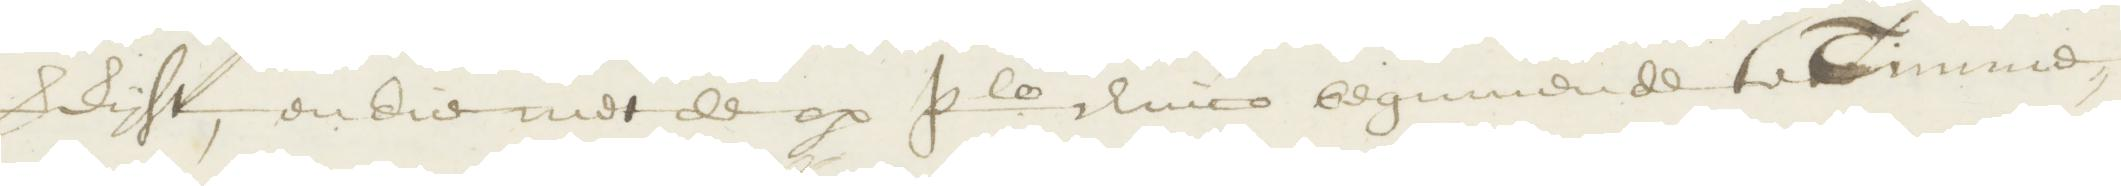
verEijst, en die met de op p=lo chinco beginnende te Timme„
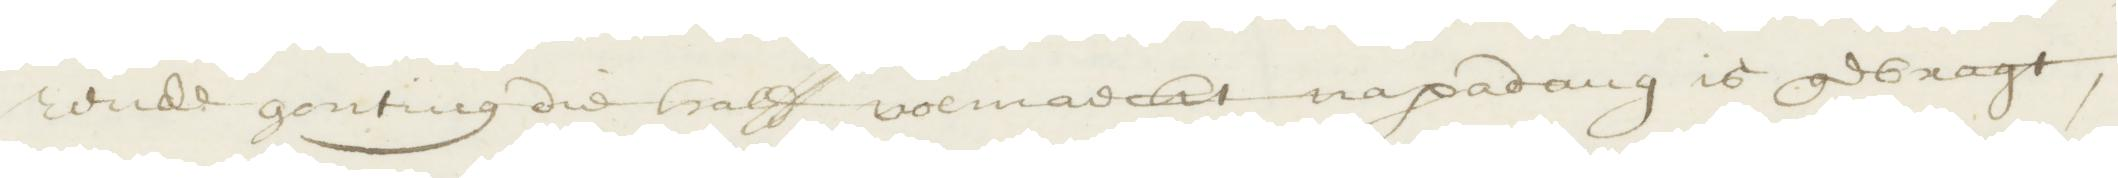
rende gonting die halff volmaeckt na padang is gebragt,
